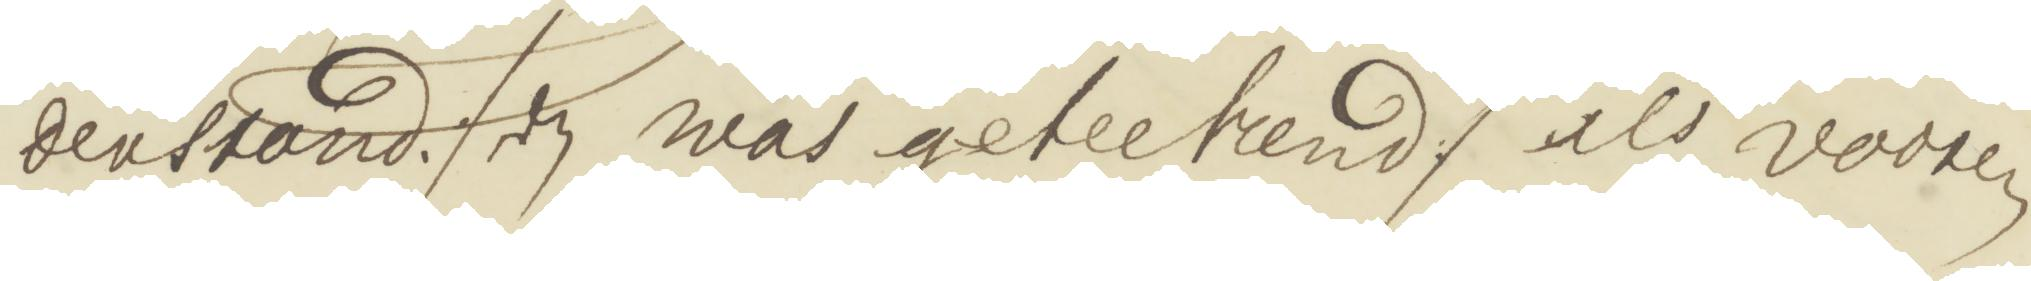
derstond:/ en was geteekend:/ als vooren
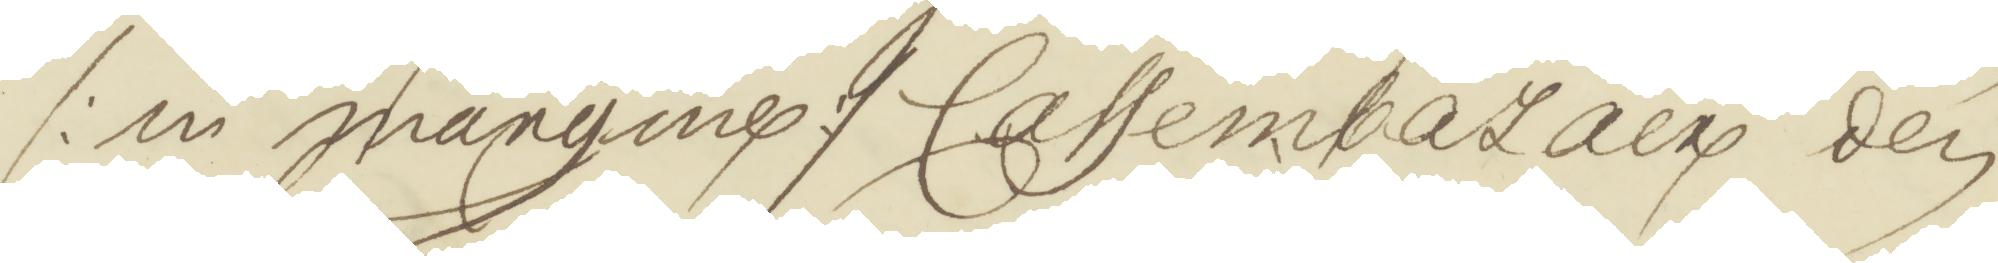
/:in margine:/ Cassembazaer den
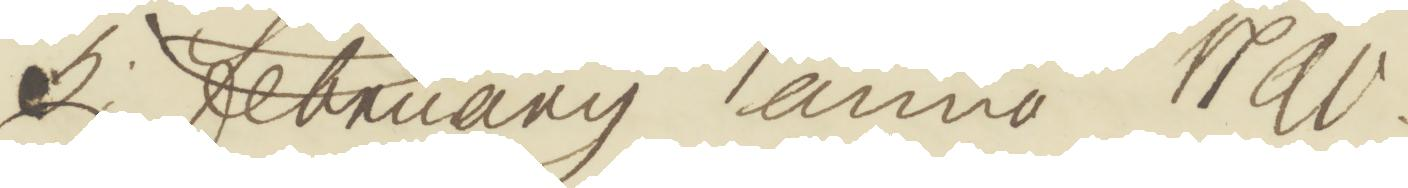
5: februarij anno 1740
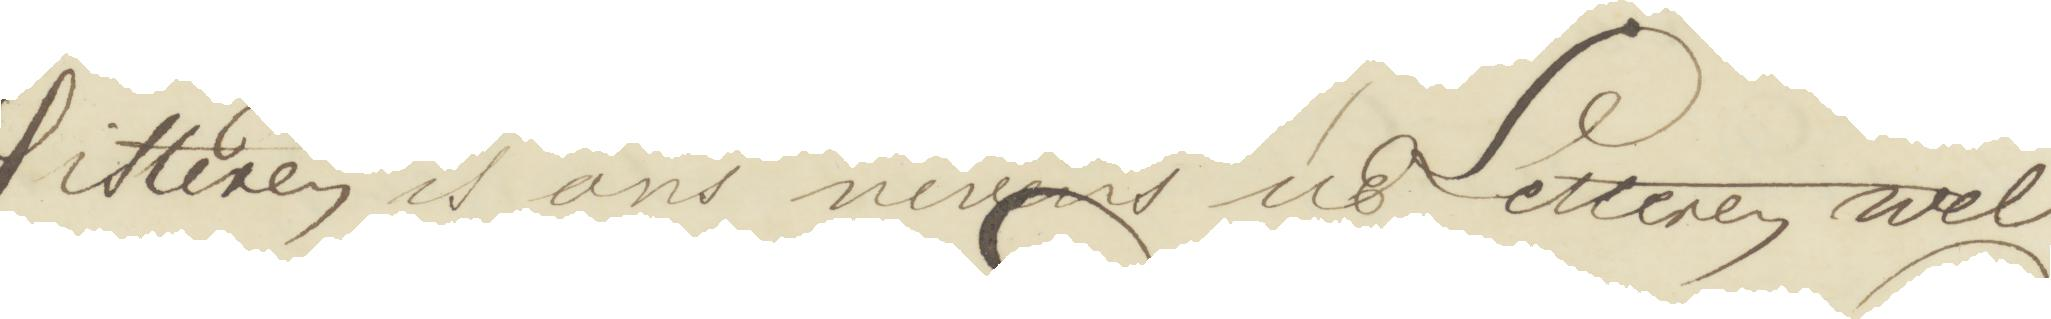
Gisteren is ons nevens uE Letteren wel
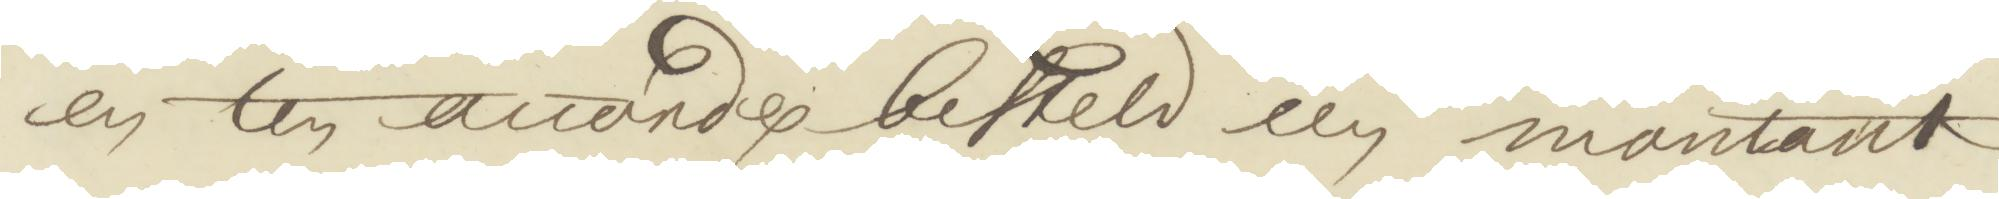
en ten accorde besteld een montant
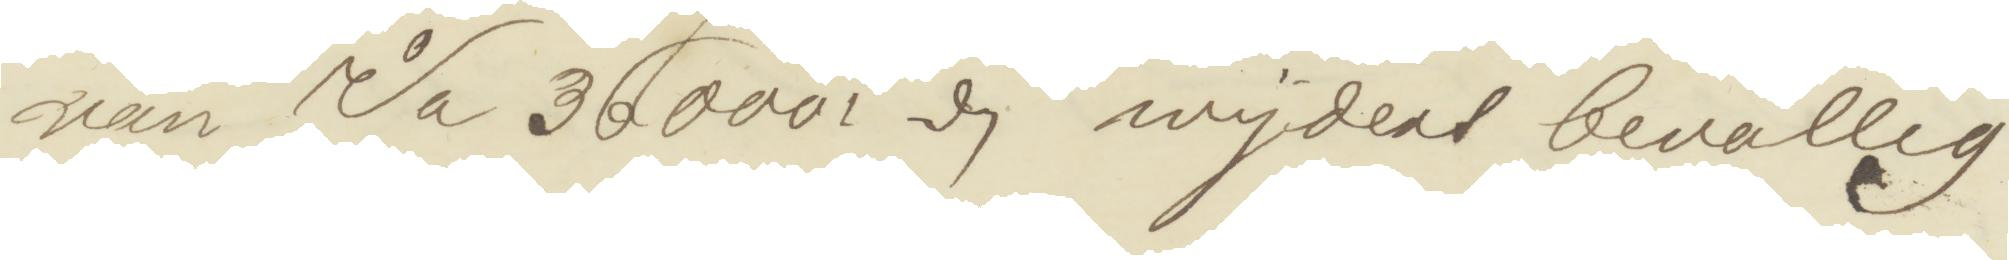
van ro/a 36000: en wijders bevallig
